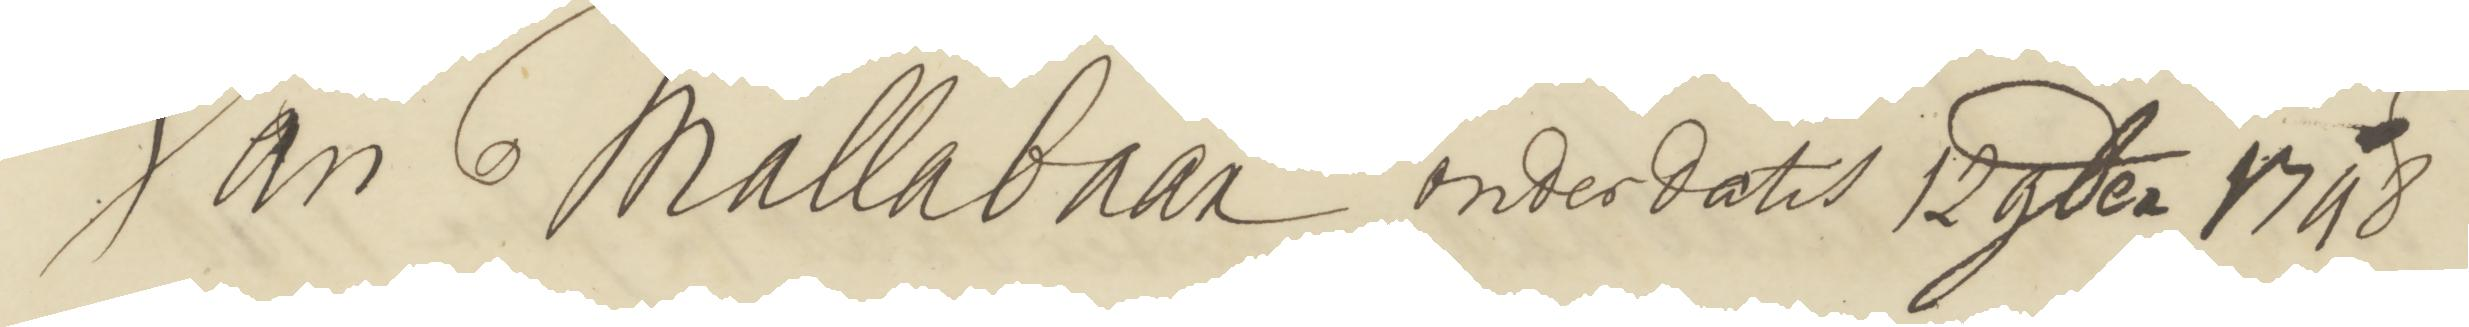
Van Mallabaar onder datis 12 gber 1748
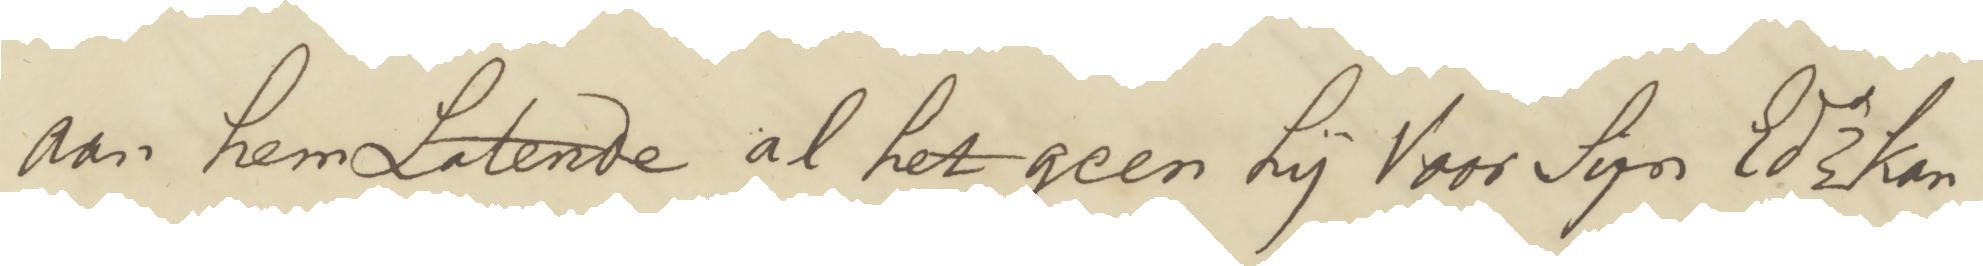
aan hem latende al het geen hij voor sijn Ed:d kan
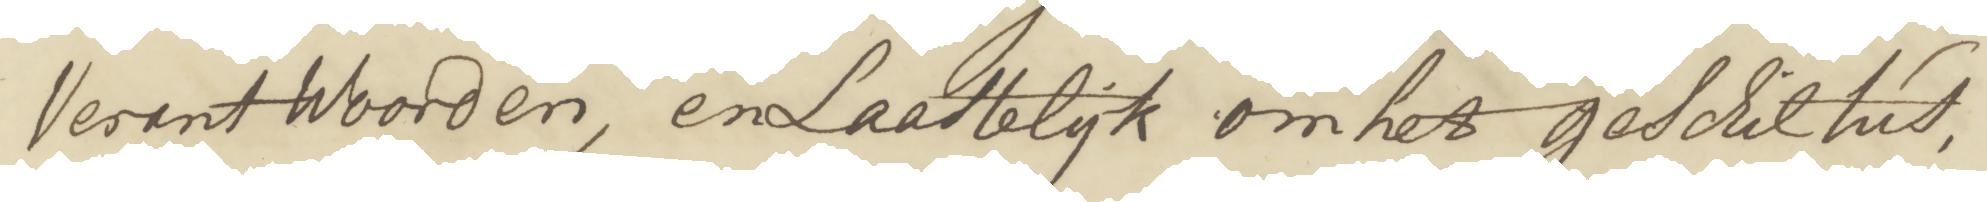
verantwoorden, en laastelijk om het geschil tus„
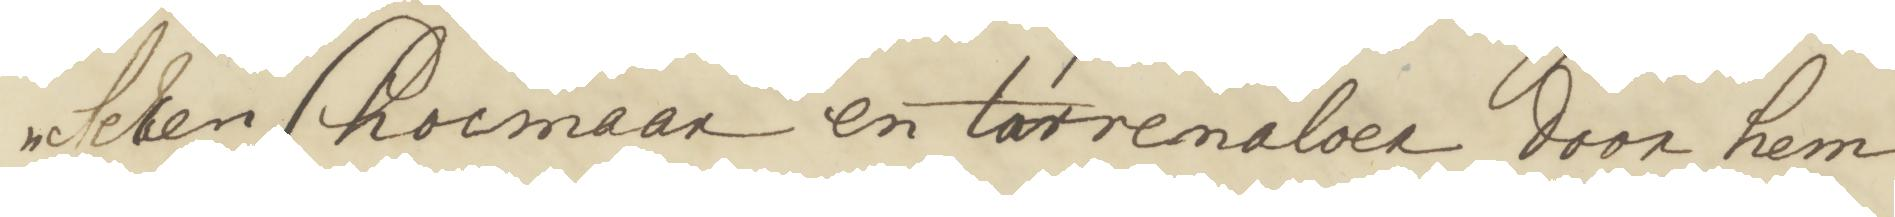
schen Choemaar en tarrenaloer door hem
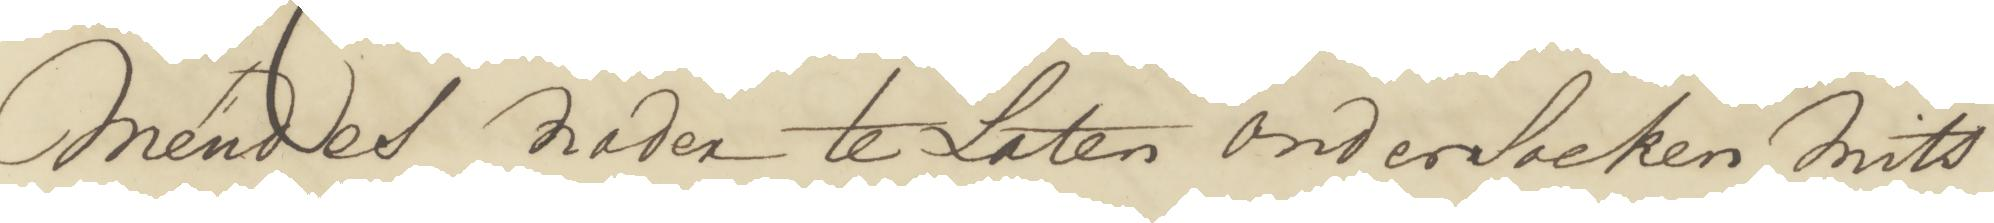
mendes nader te laten ondersoeken mits
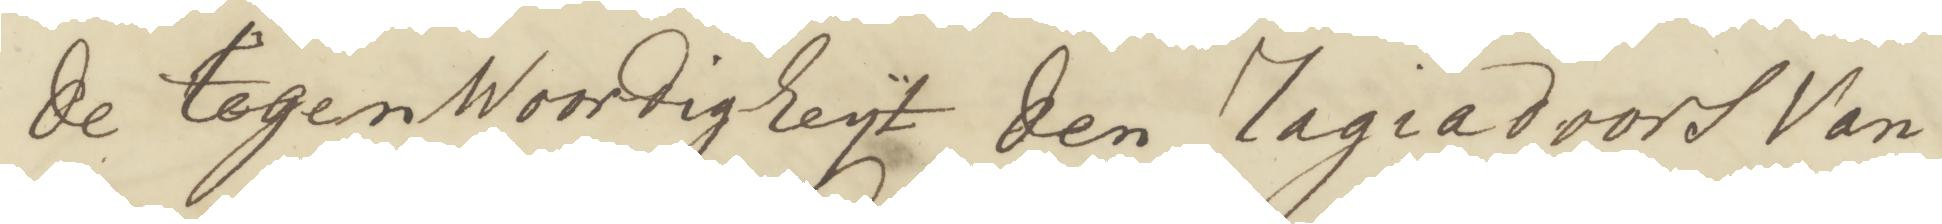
de tegenwoordigheijt den Ragiadoors van
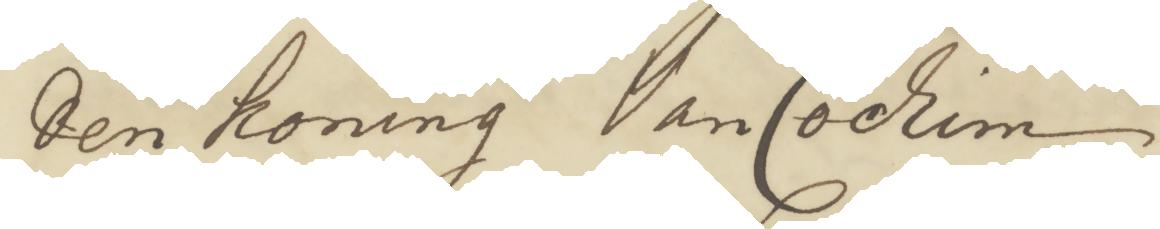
den koning van Cochim
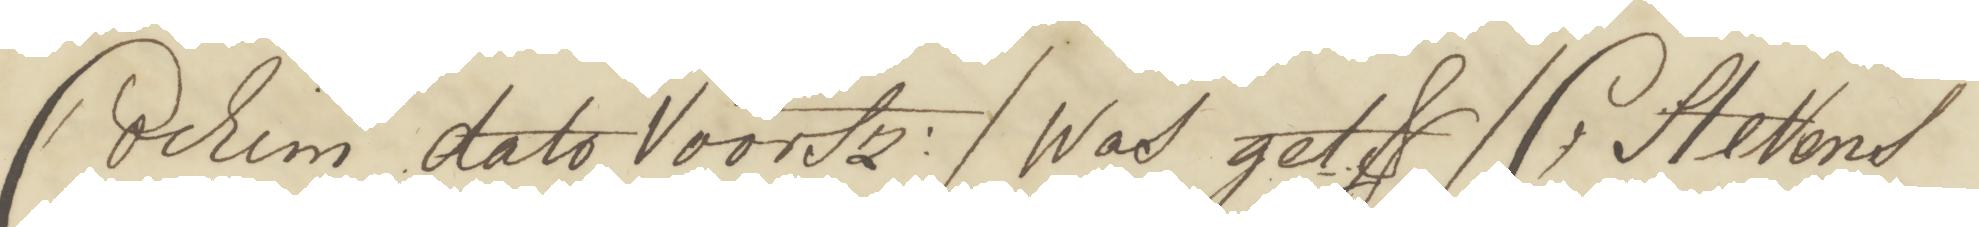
Cochim dato voorsz: /was getver/ C: stevens
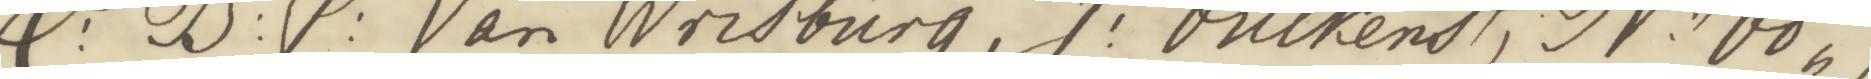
C: B: f: van wrisburg, J: bulkens, N: bo„
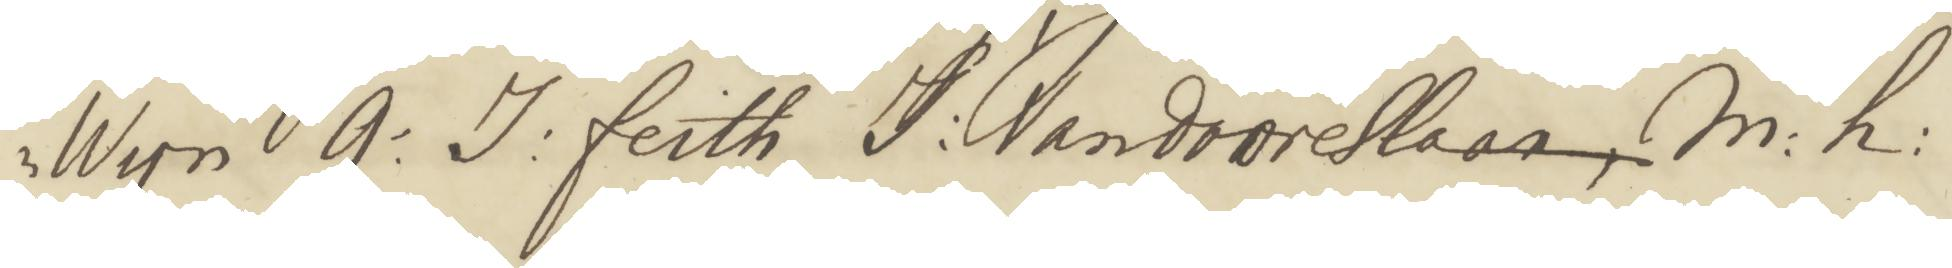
„wyn g: I: feith, I: vandooreslaar, m: h:
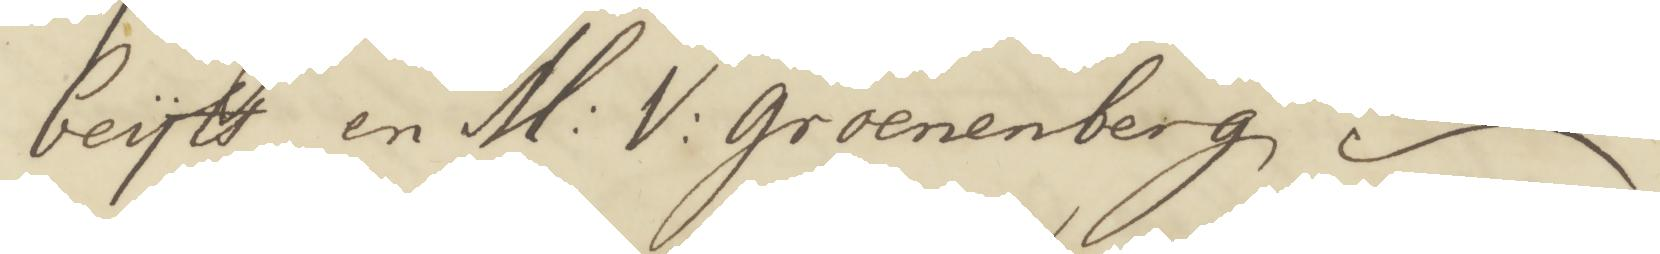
beijts en M: V: groenenberg —
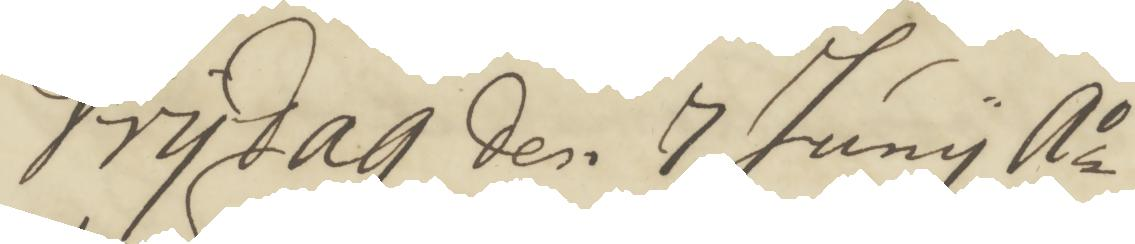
Vrijdag den 7 Junij A=o
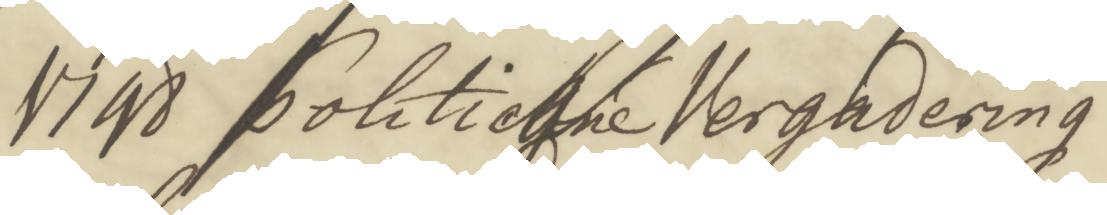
1748 politicque vergadering
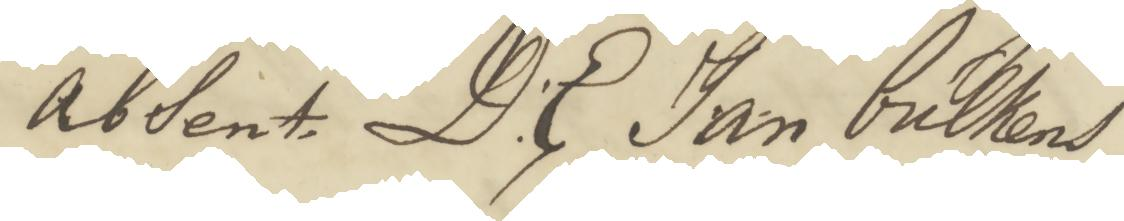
absent D:E Jan bulkens
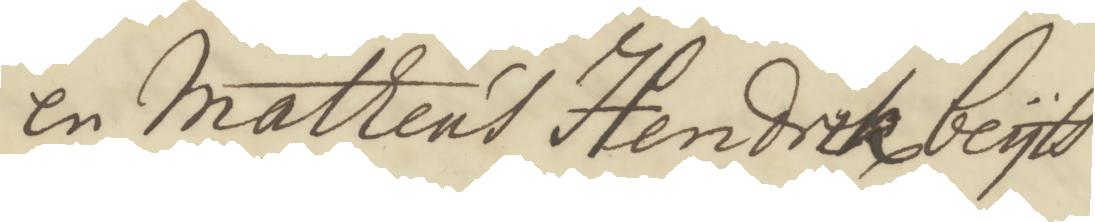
en Matheus Hendrik beijts
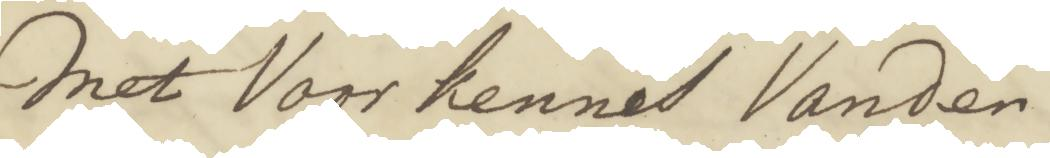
met voor kennis vanden
